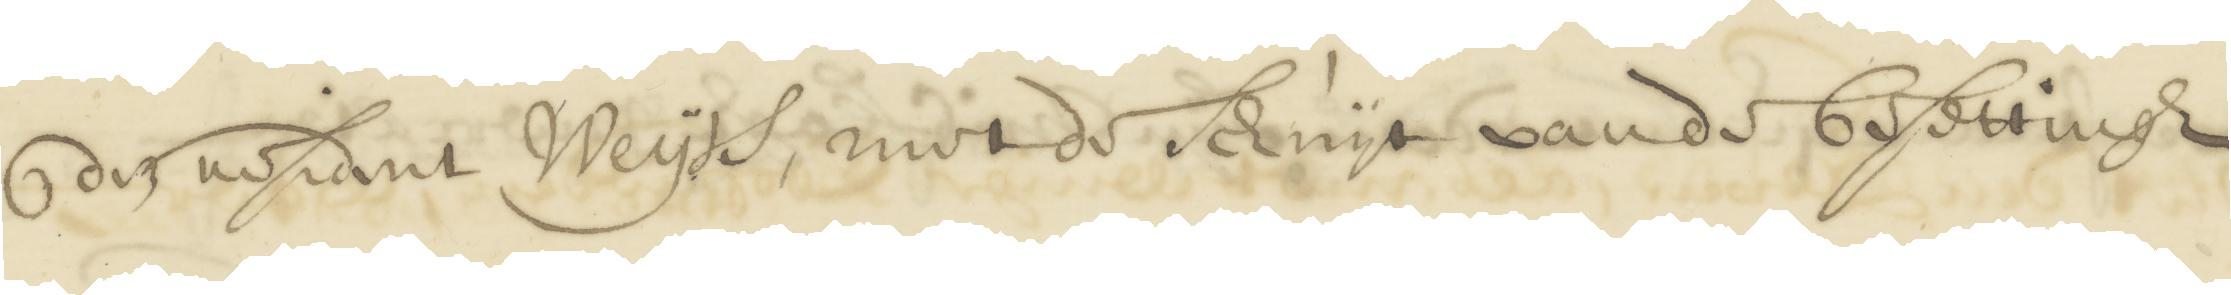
den resident Weijts, met de Schuijt van de besettingh
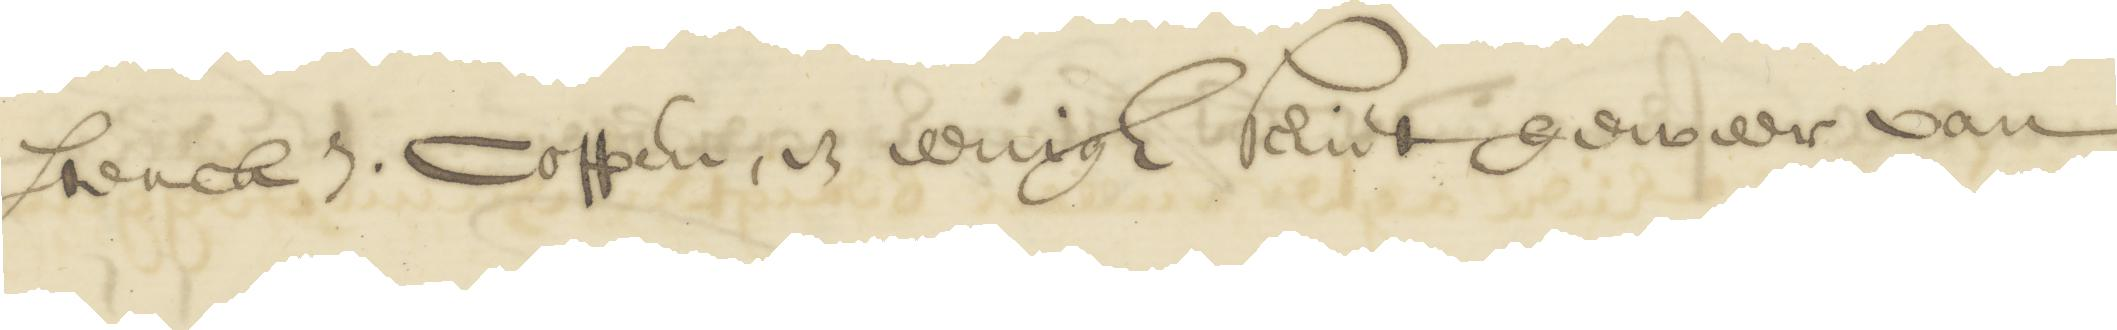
sterck 7. Coppen, en eenigh schiet geweer van
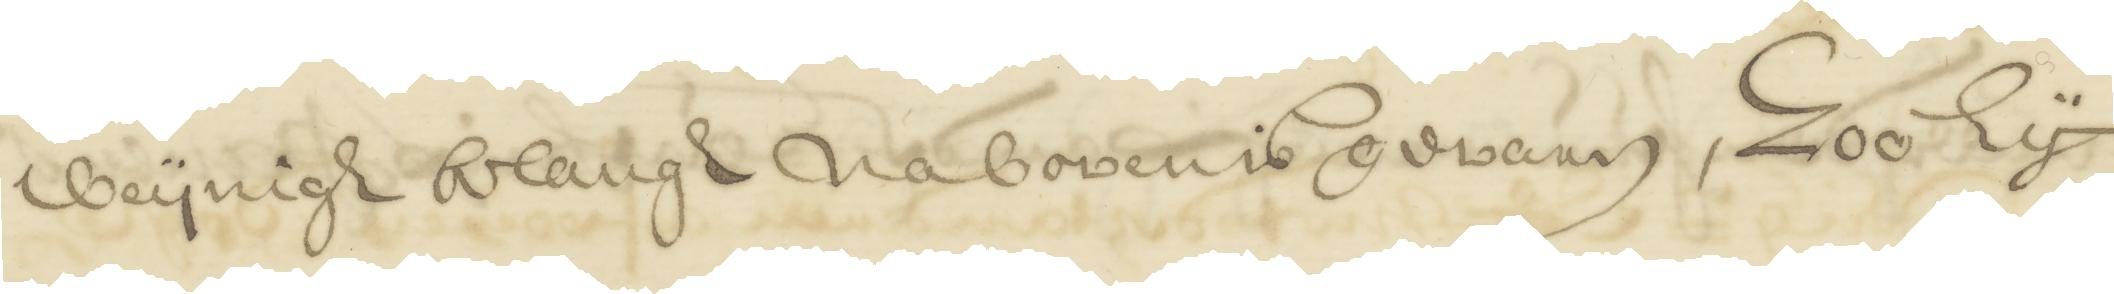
weijnigh belangh na boven is gevaren, Zoo hij
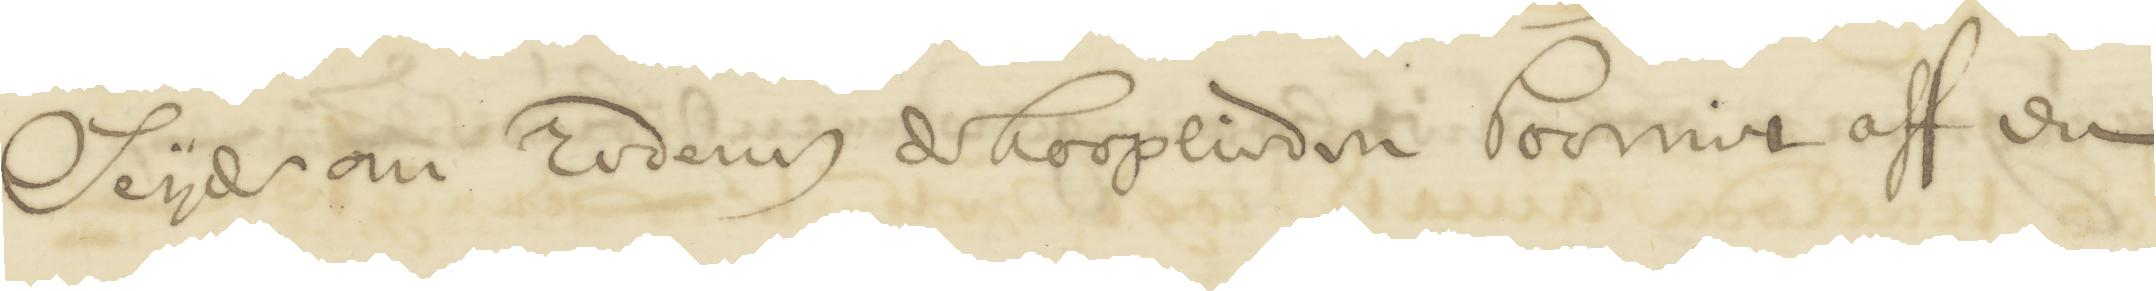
Seijde om redenen de kooplieden Soo niet aff en
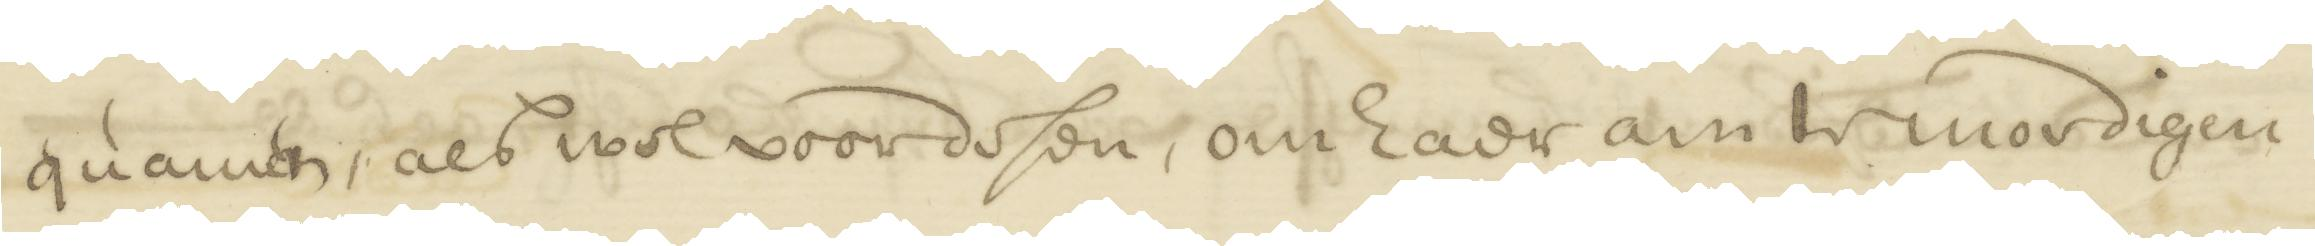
quamen; als wel voor desen, om haer om te moedigen
